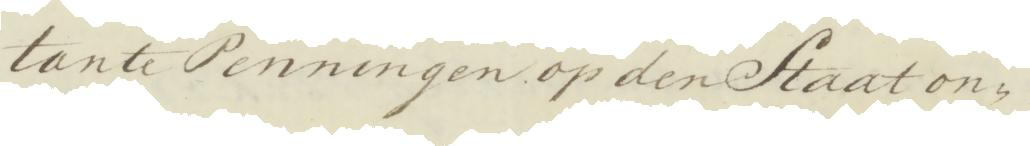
tante Penningen op den staat on„
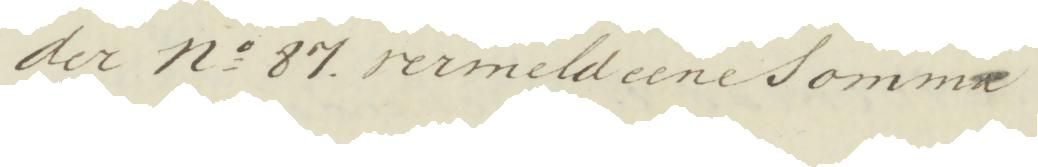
der N=o 87. vermeld eene somma
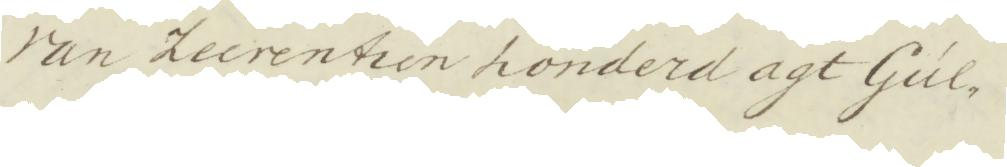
van zeeventien honderd agt Gul„
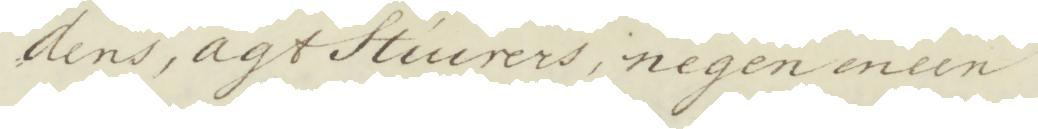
dens, agt stuivers, negen en een
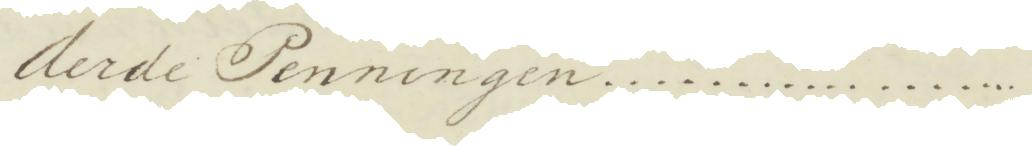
derde Penningen. . . . . . . . . . . . . . . . . .
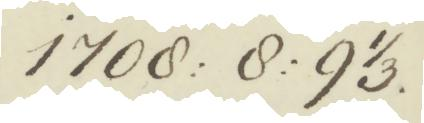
1708 : 8 : 9 1/3.
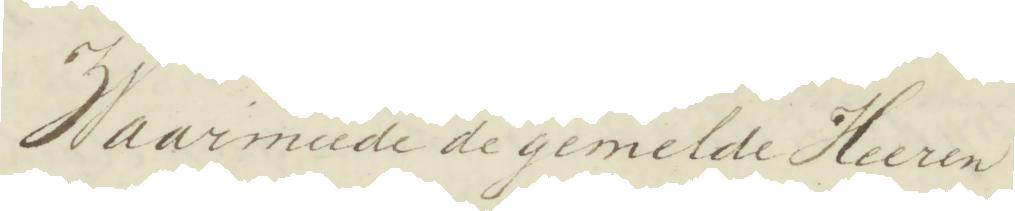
Waarmeede de gemelde Heeren
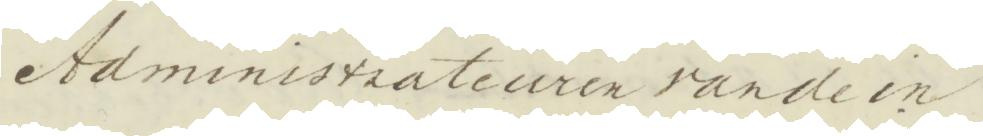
Administrateuren van de in
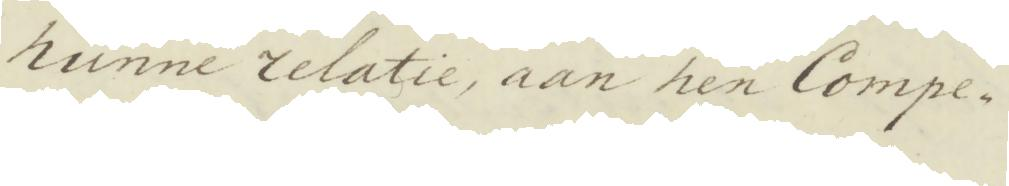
hunne relatie, aan hen Compe„
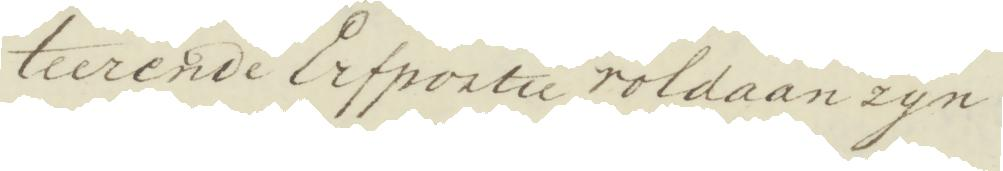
teerende Erfportie voldaan zijn
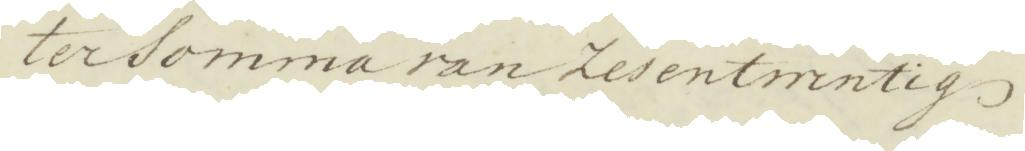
ter somma van zes en twintig
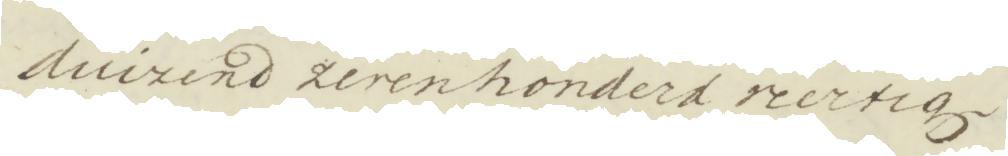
duizend zevenhonderd veertig
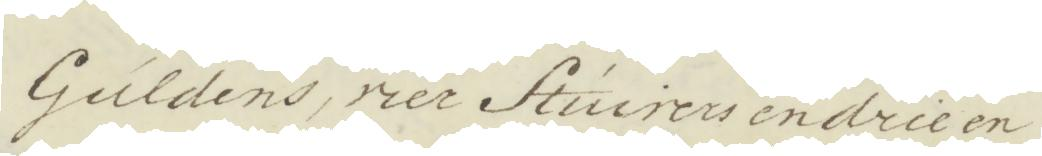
Guldens, vier Stuivers en drie en
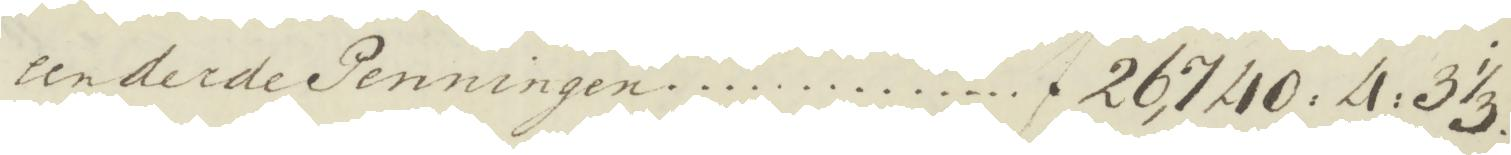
een derde Penningen. . . . . . . . . . . . . . ƒ 26,740 : 4 : 3 1/3.
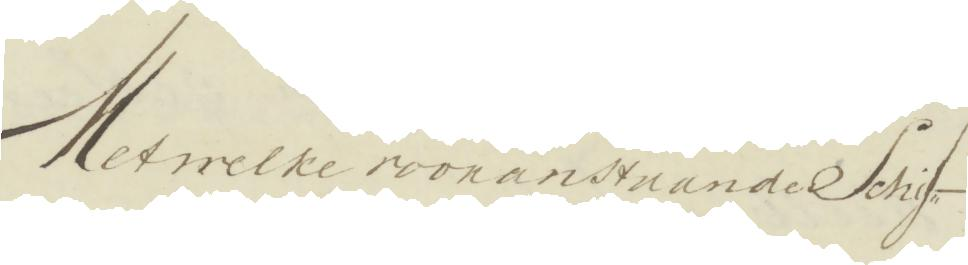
Met welke vooranstaande schif
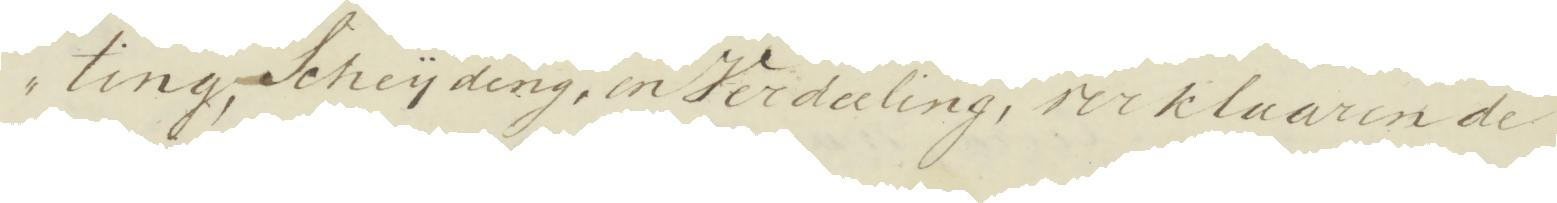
„ting, scheijding, en Verdeeling, verklaaren de
